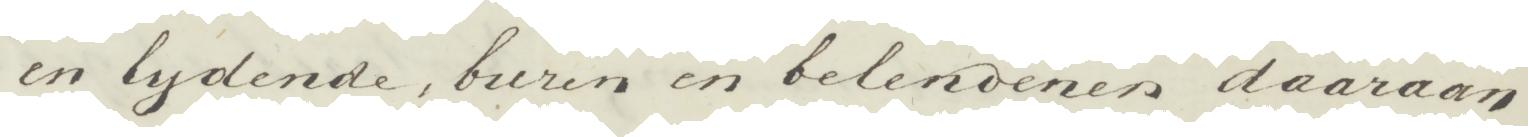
en lydende, buren en belendenen daaraan
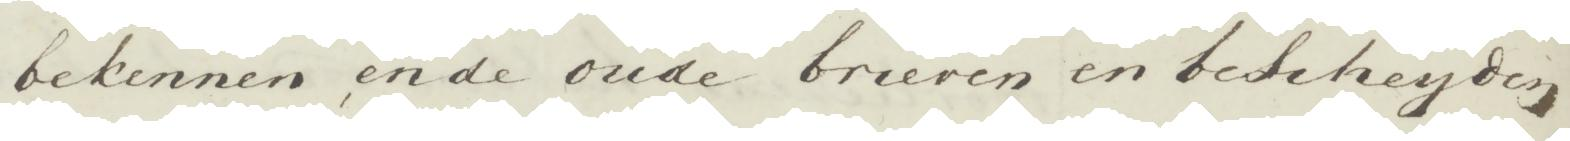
bekennen, en de oude brieven en bescheyden
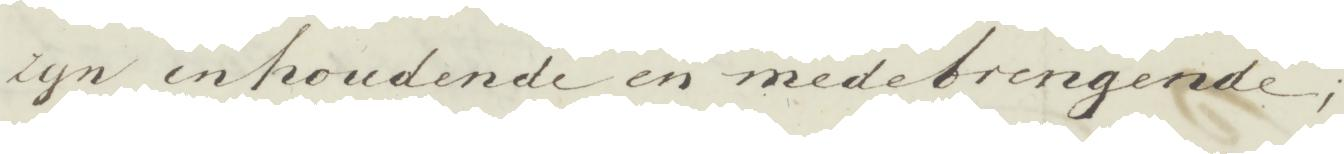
zyn inhoudende en medebrengende;
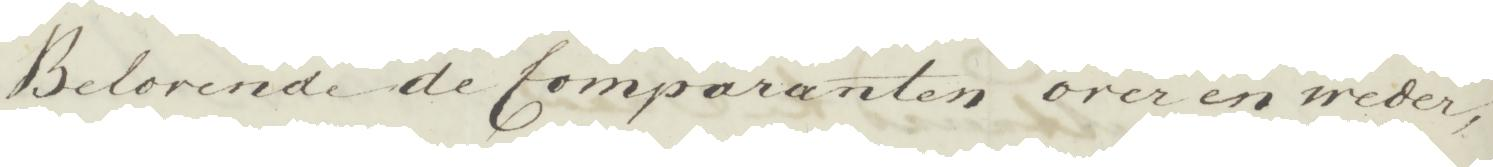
Belovende de Comparanten over en weder,
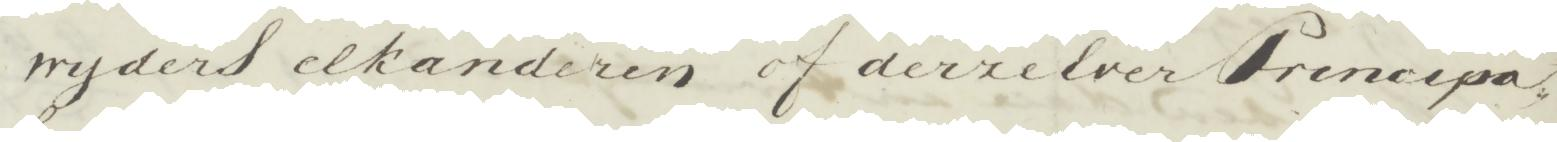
wyders elkanderen of derzelver Principa„
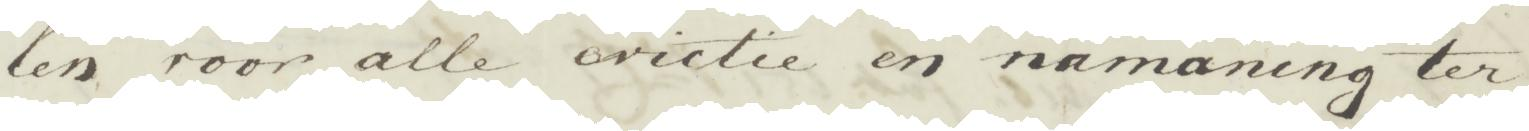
=len voor alle evictie en namaning ter
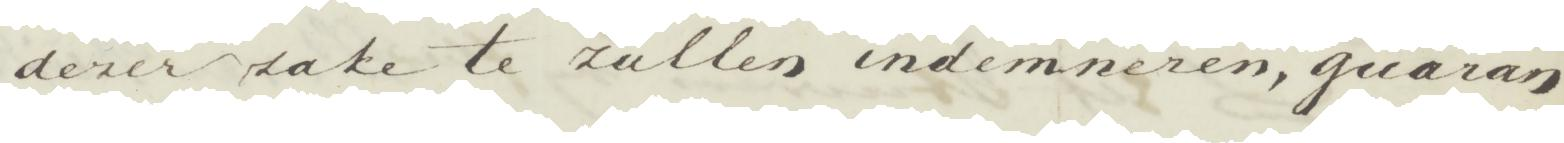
dezer zake te zullen indemneren, guaran
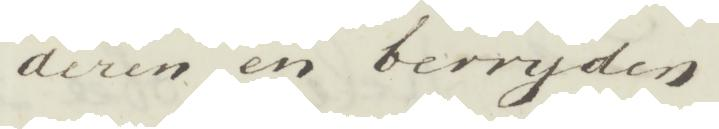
=deren en bevryden.
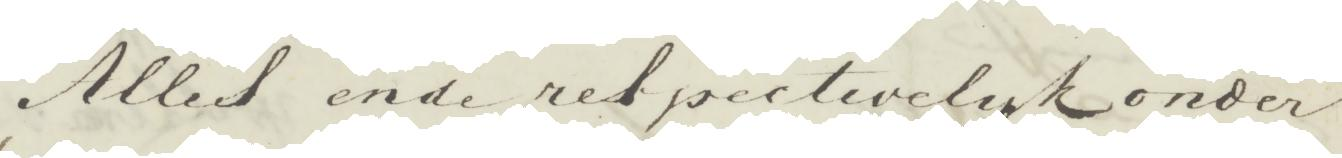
Alles ende respectivelyk onder
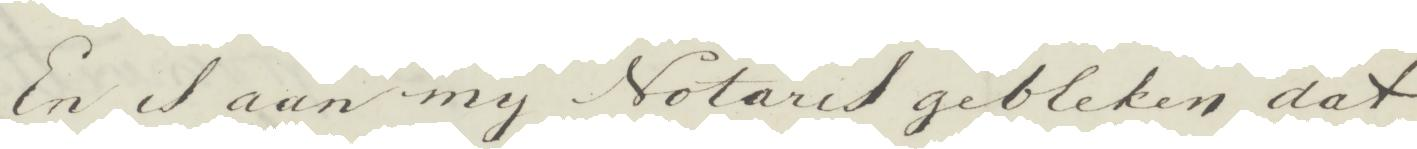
En is aan mij Notaris gebleken dat
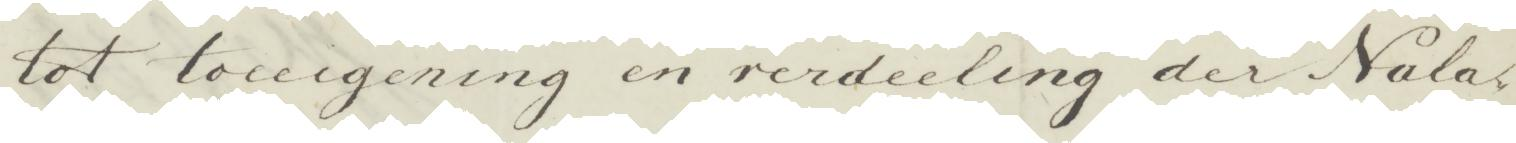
tot toeeigening en verdeeling der Nala„
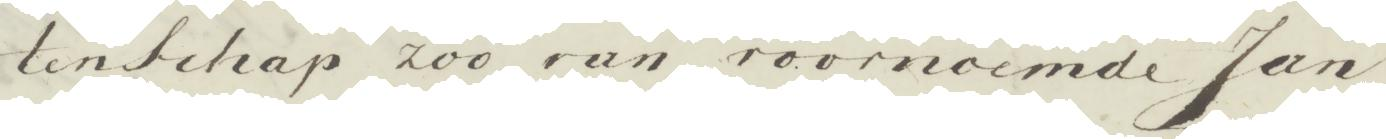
tenschap, zoo van voornoemde Jan
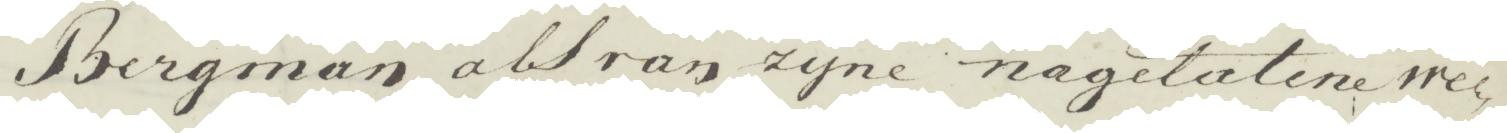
Bergman, als van zyne nagelatene we„
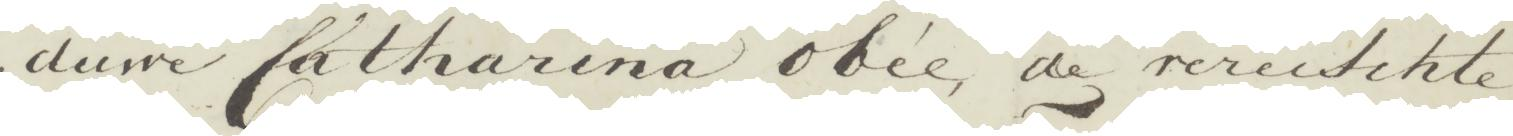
„duwe Catharina obée, de vereischte
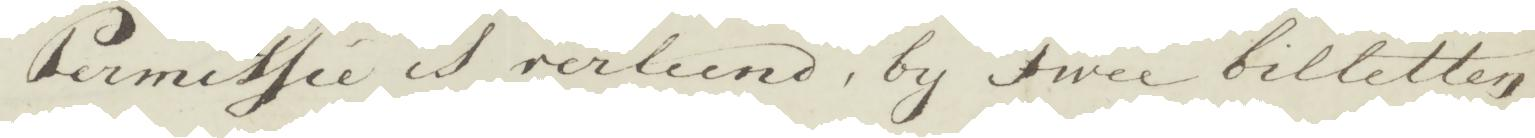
Permissie is verleend, by Twee billetten
